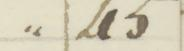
„ 45
